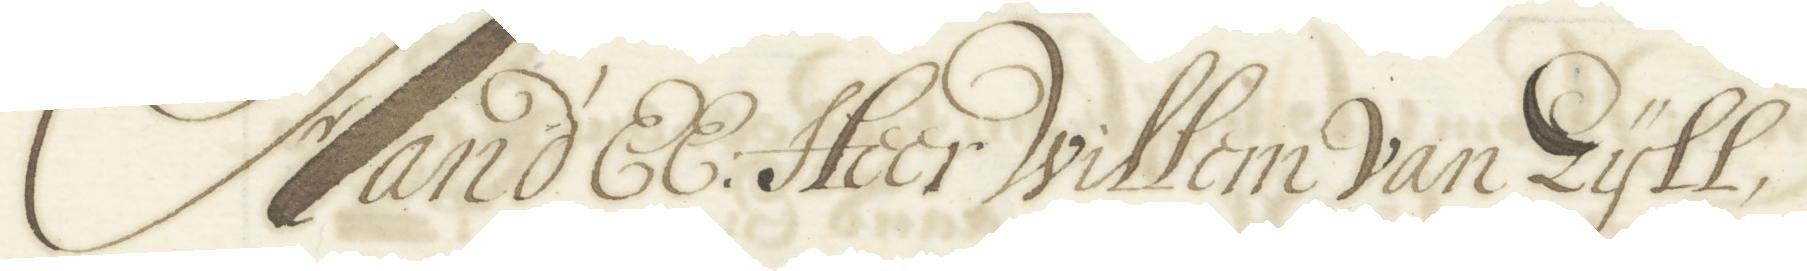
Aan d' EE: Heer Willem van Zijll,
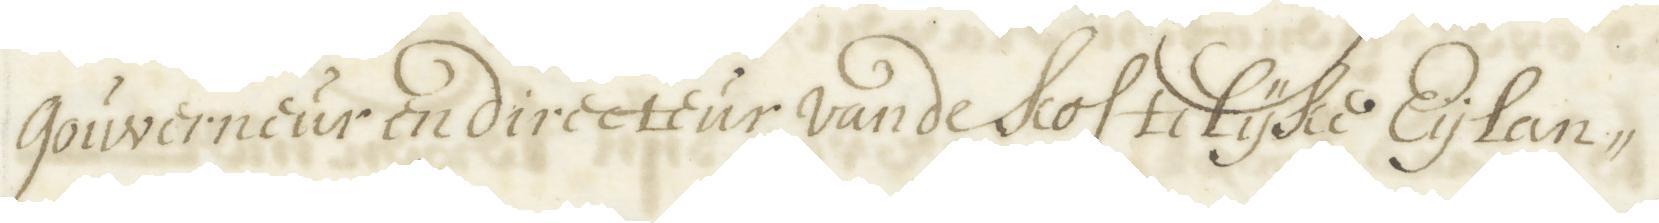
gouverneur en directeur van de kostelijke Eijlan„
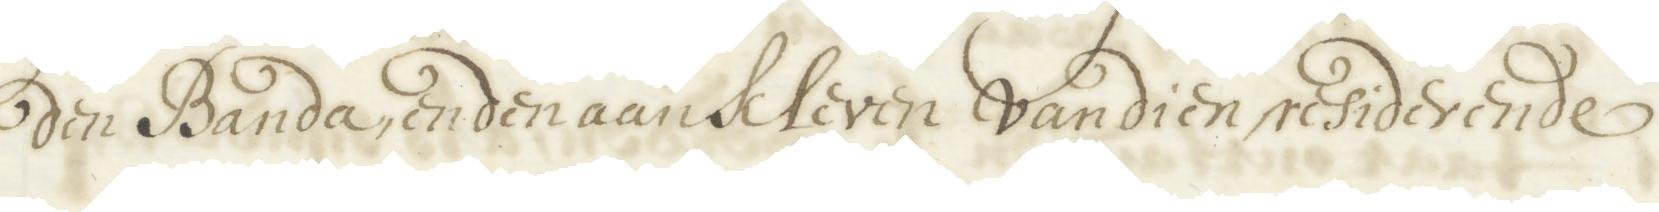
den Banda, en den aankleven van dien residerende
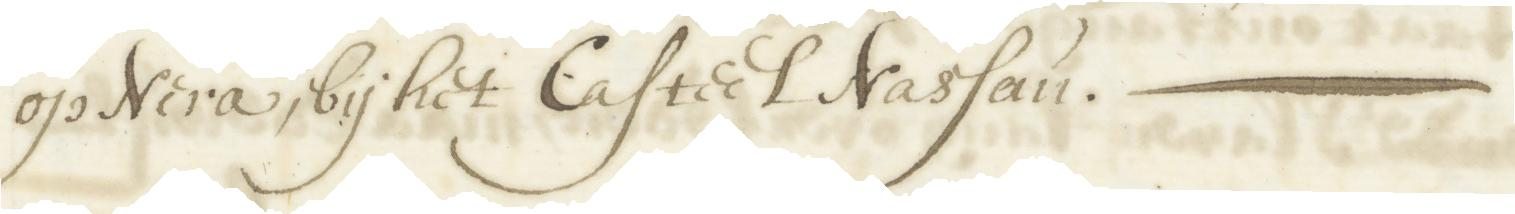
op Nera, bij het Casteel Nassau. —
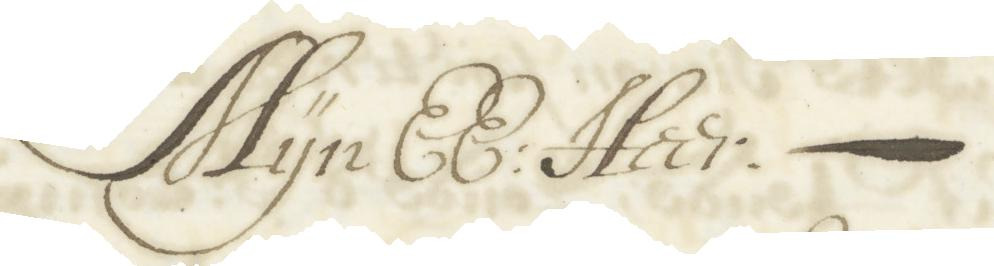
Mijn EE: Heer: —
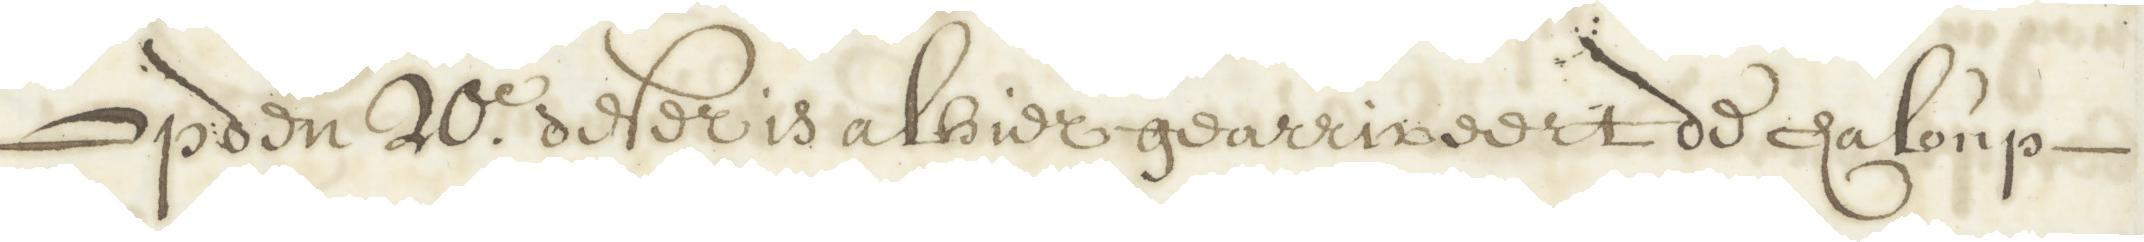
Op den 20:e deser is alhier gearriveert de chaloup —
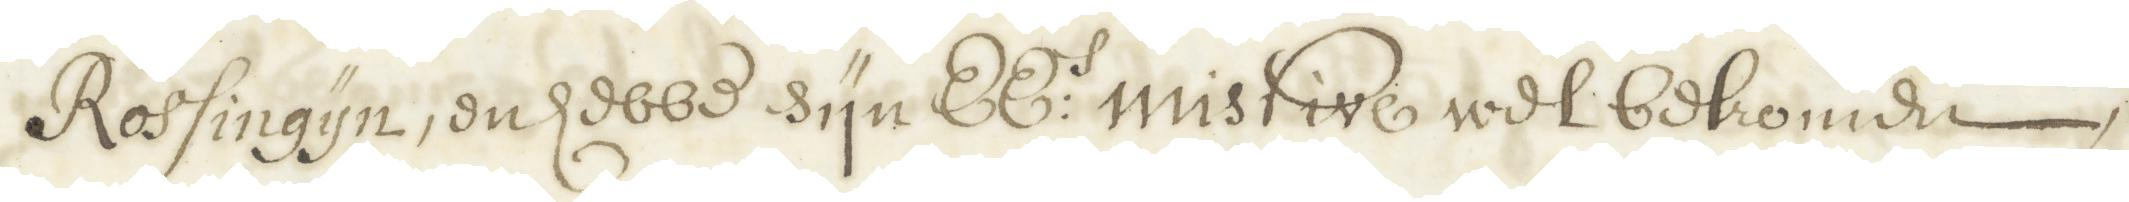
Rossingijn, en hebbe sijn EE:s missive wel bekomen,
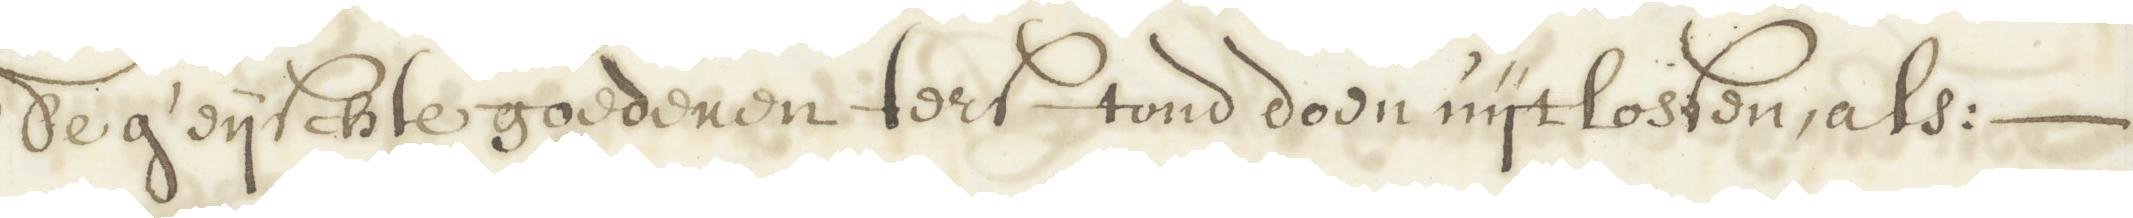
de g'eijschte goederen terstond doen uijtlossen, als: —
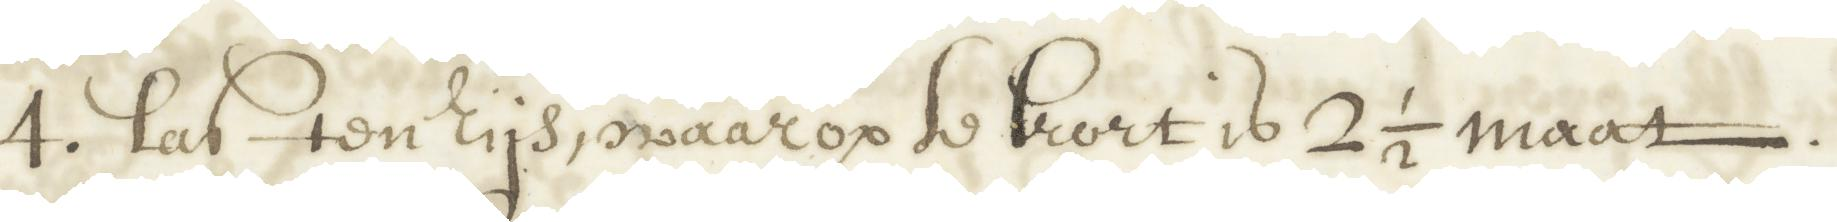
4. lasten rijs, waar op te kort is 2½ maat.
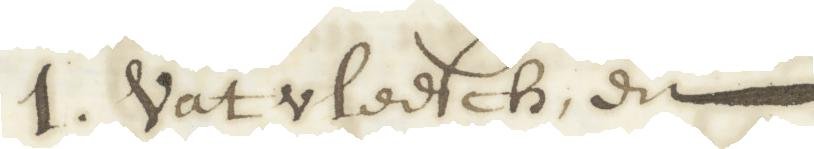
1. vat vleesch, en
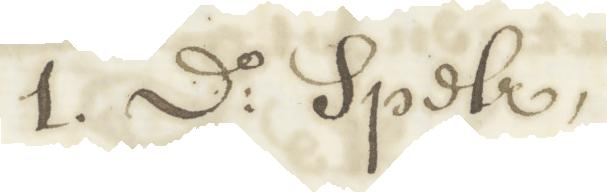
1. d:o spek,
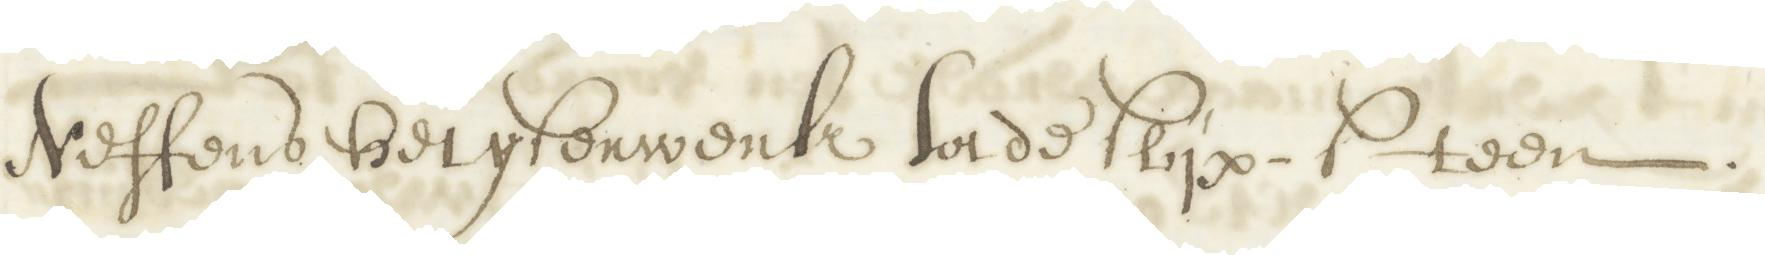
Neffens het ijserwerk tot de slijp-steen.
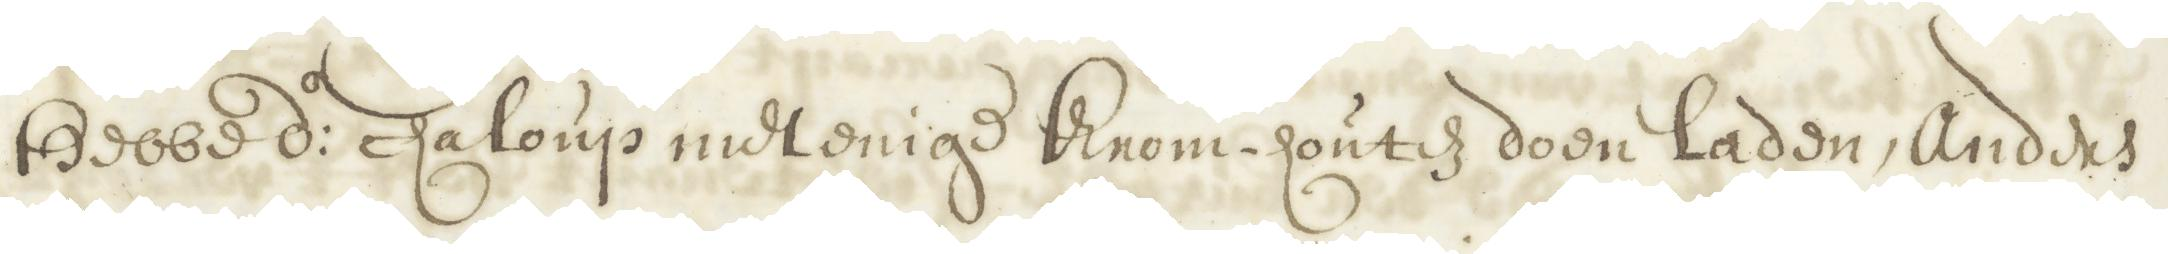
hebbe d:o chaloup met enige krom-houten doen laden, anders
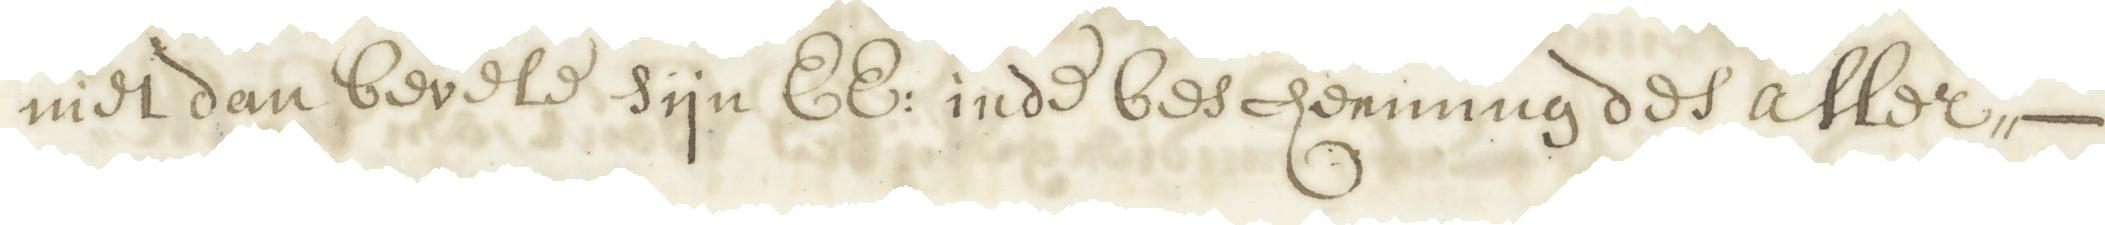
niet dan bevele sijn EE: inde bescherming des aller„ —
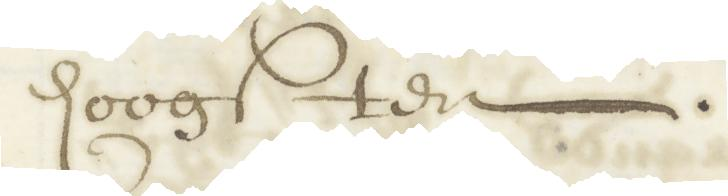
hoogsten.
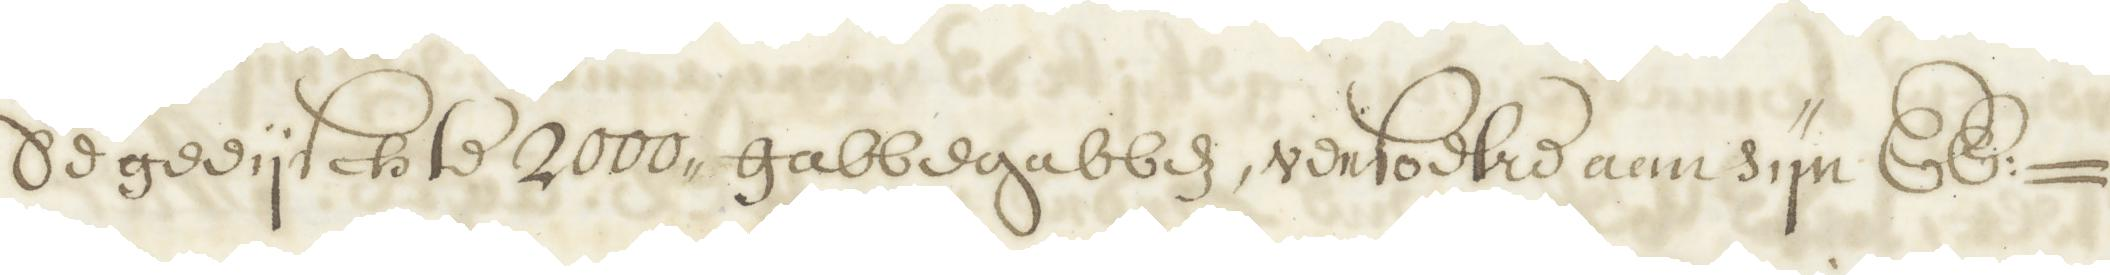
de geeijschte 2000„ gabbegabben, versoeke aan sijn EE:=
